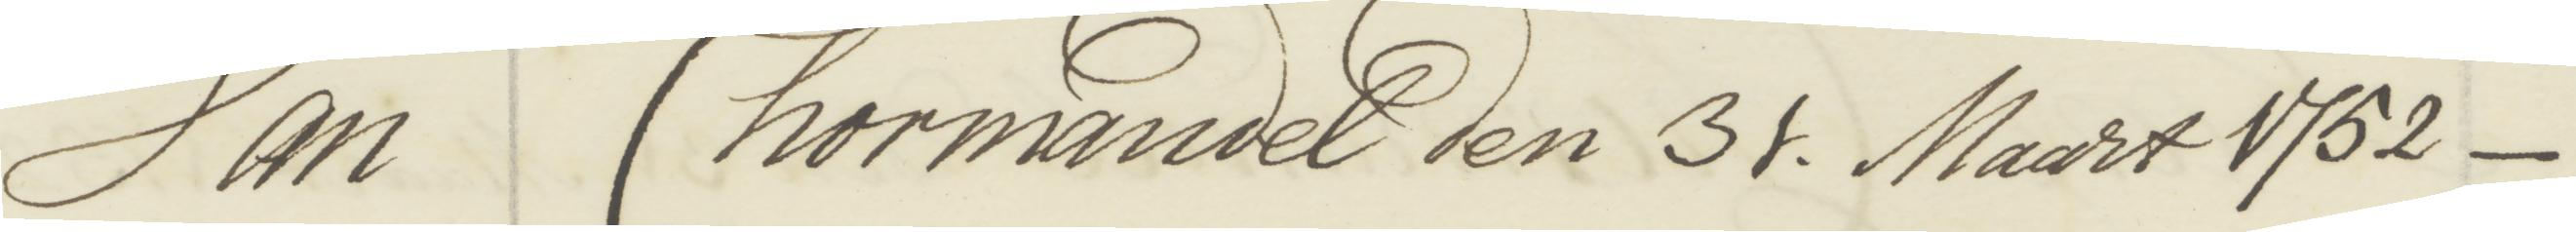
Van Chormandel den 31. Maart 1752 —
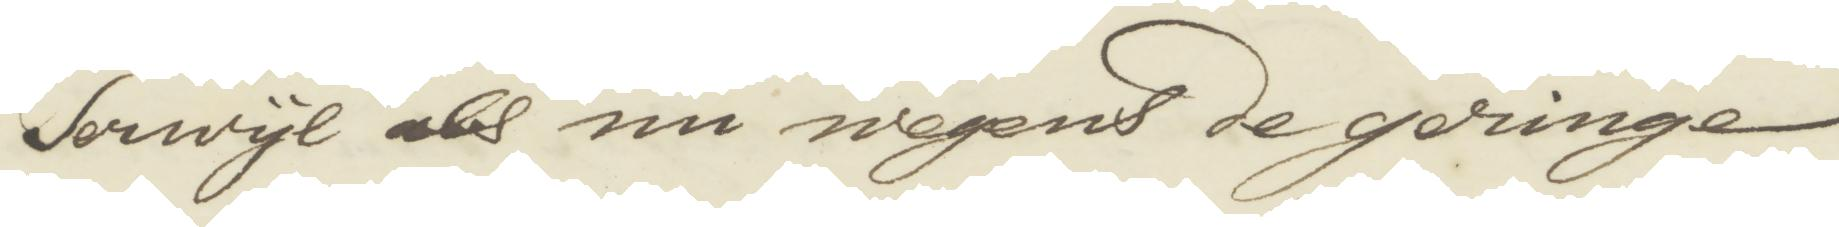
Terwijl als nu wegens de geringe
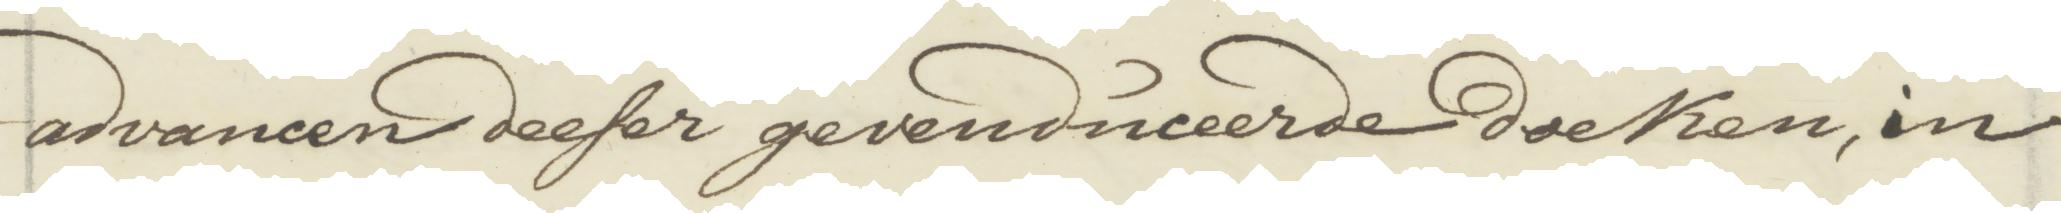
advancen deeser gevenduceerde doeken, in
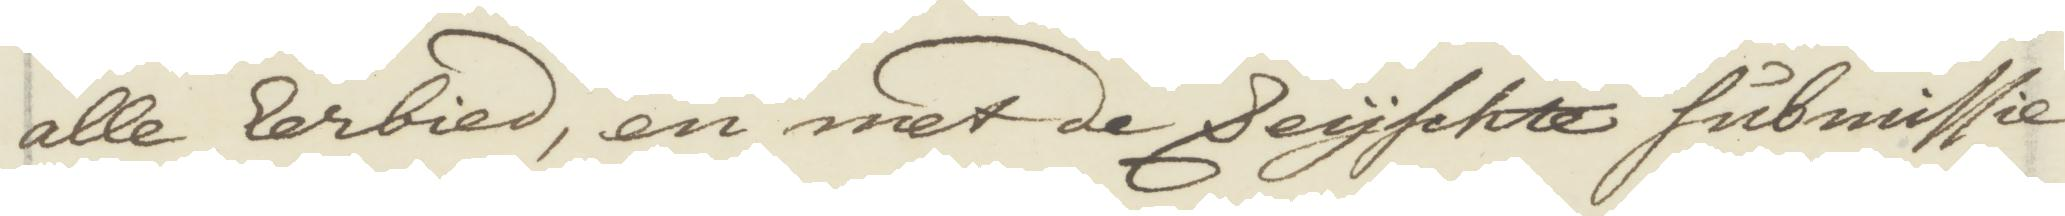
alle Eerbied, en met de vereijschte submissie
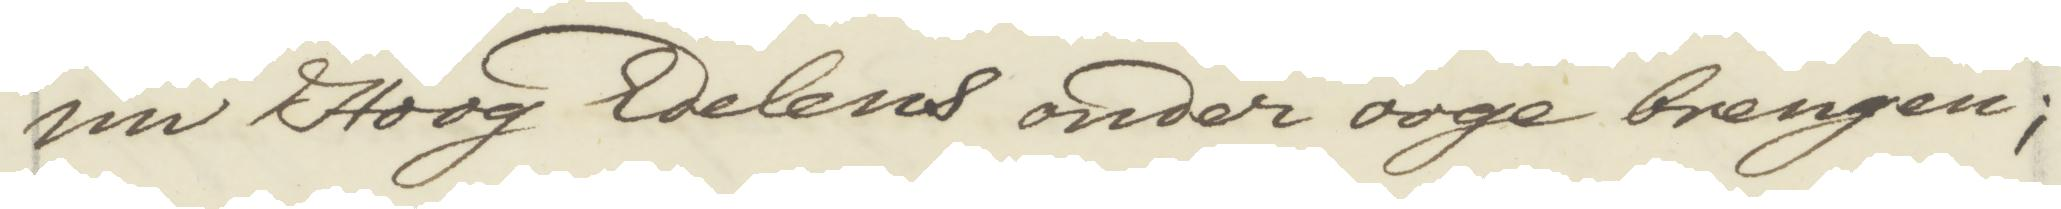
uw Hoog Edelens onder ooge brengen;
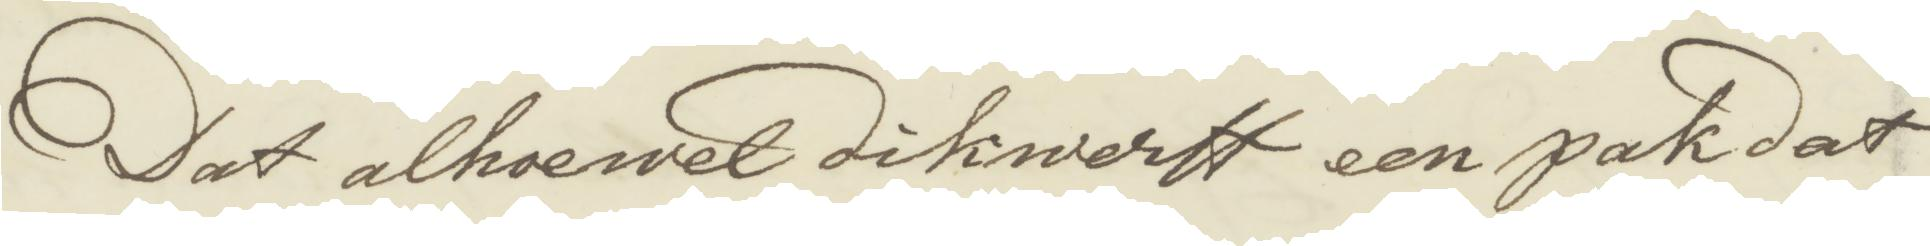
Dat alhoewel dikwerff een pak dat
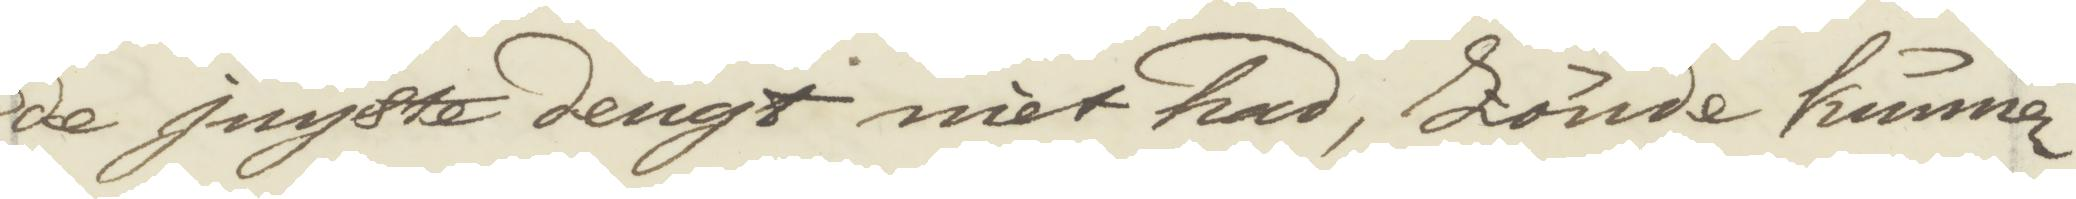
de juijste deugt niet had, zoude kunnen
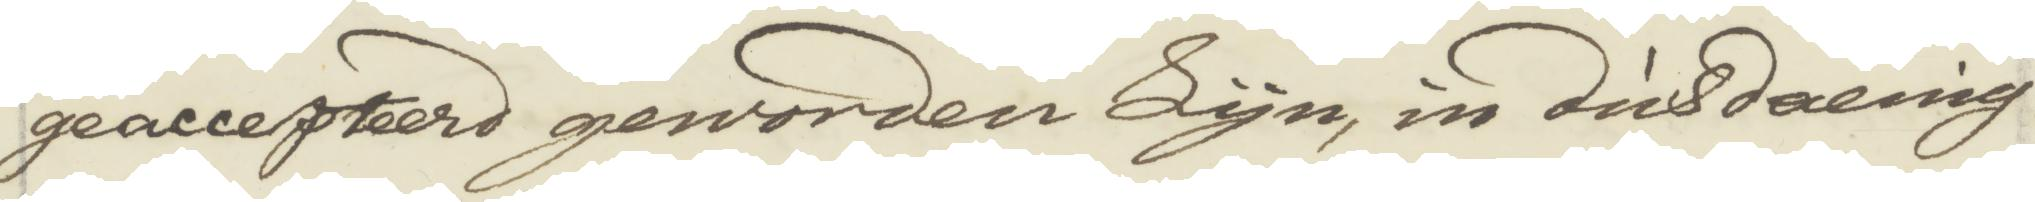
geaccepteerd geworden zijn, in dusdaenig
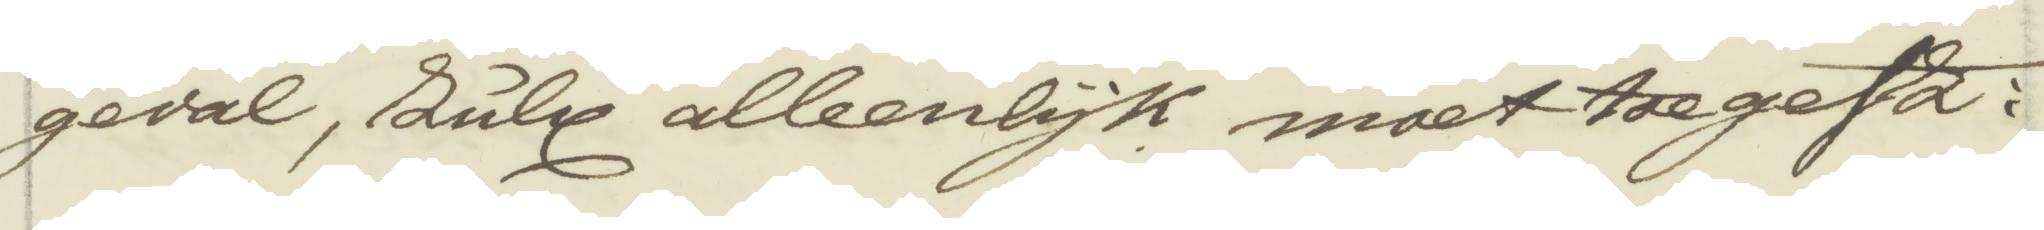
geval, zulx alleenlijk moet toegesz:
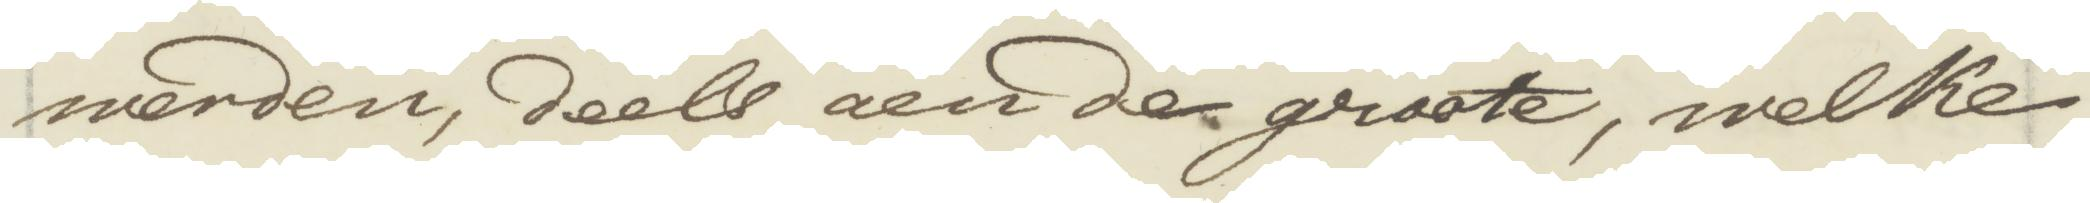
werden, deels aen de groote, welke
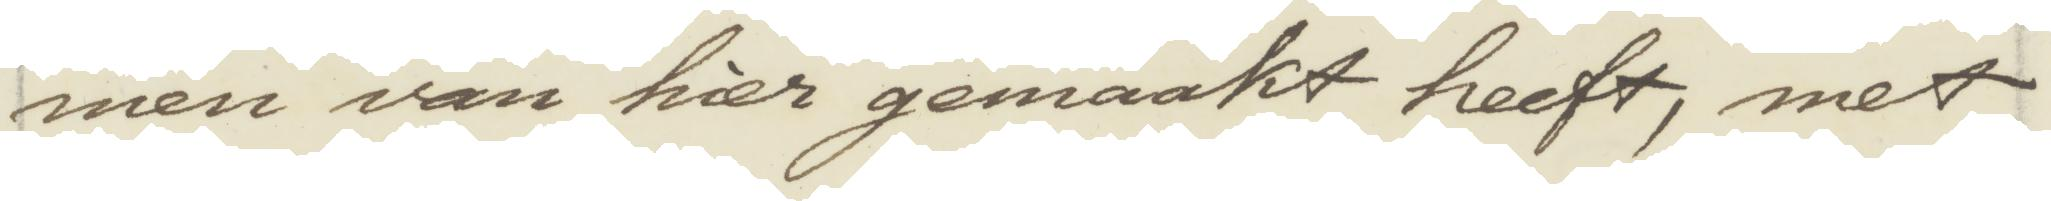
men van hier gemaakt heeft, met
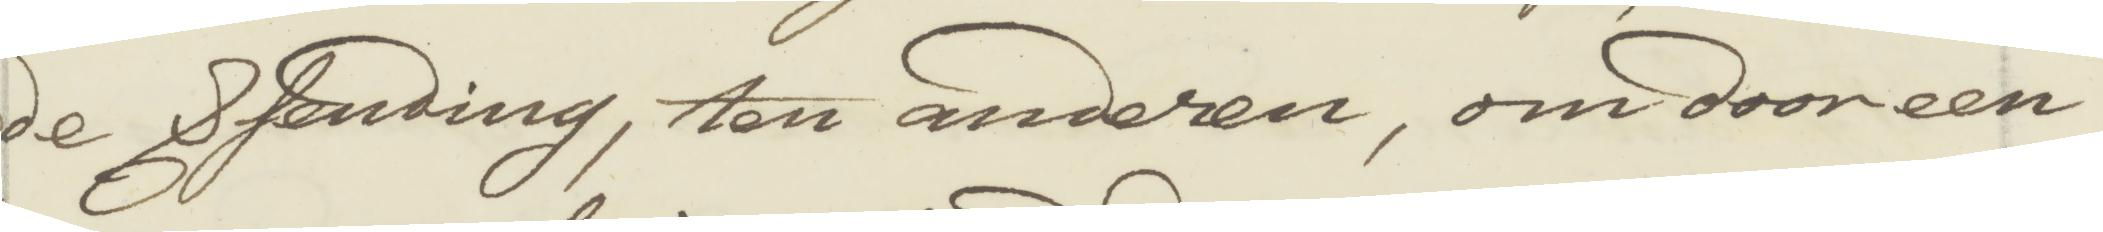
de versending, ten anderen, om door een
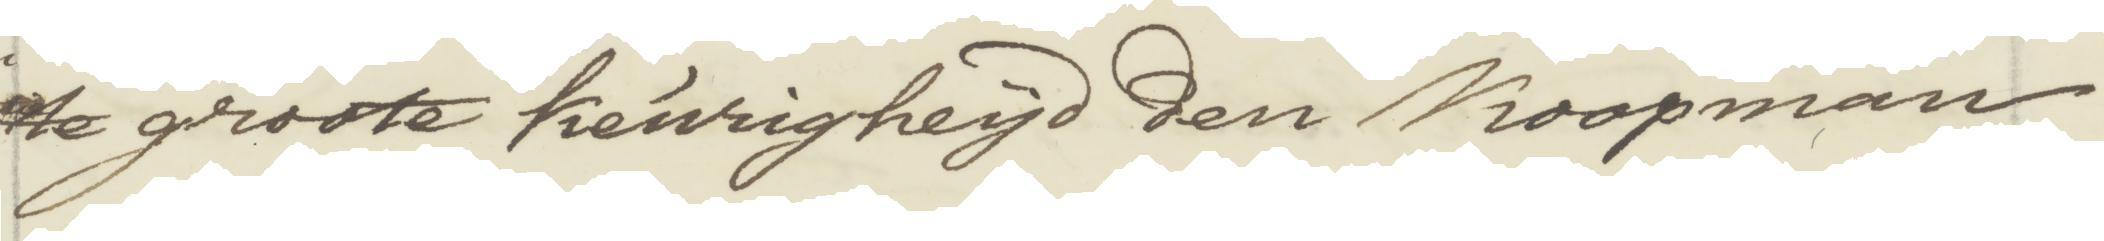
te groote keurigheijd den koopman
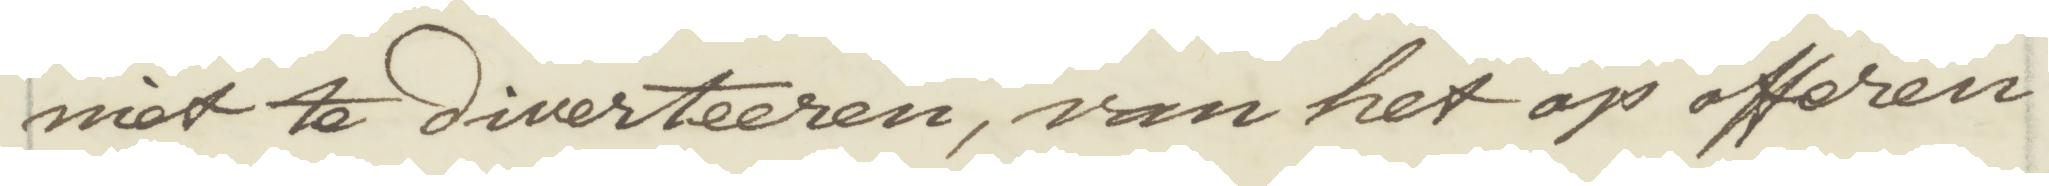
niet te diverteeren, van het op offeren
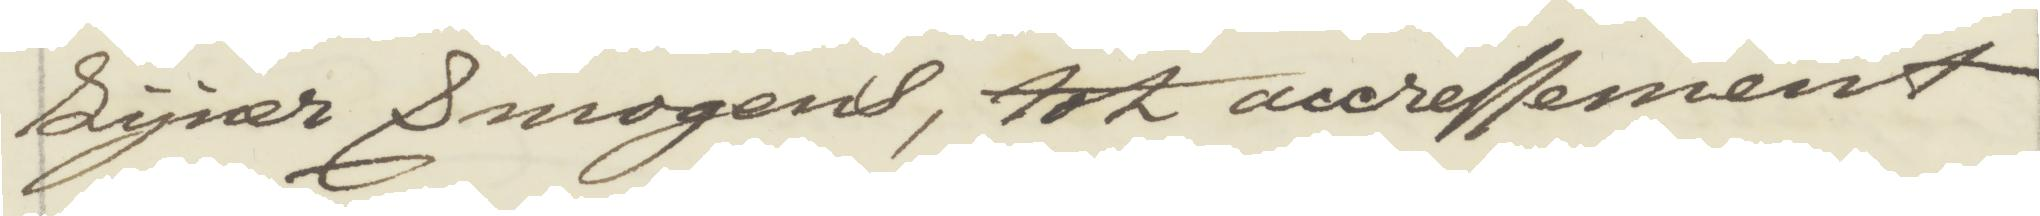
zijner vermogens, tot accressement
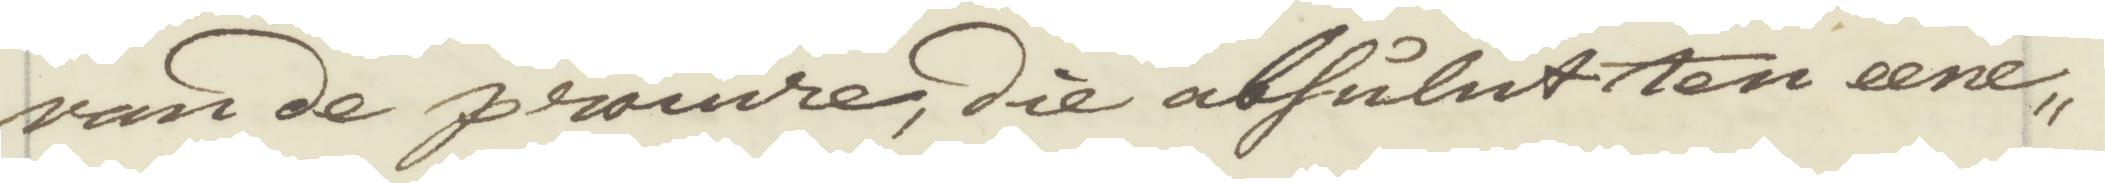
van de procure, die absulut ten eene„
